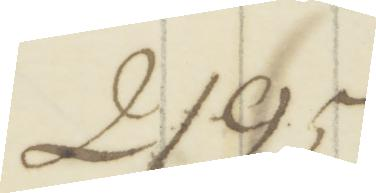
2195
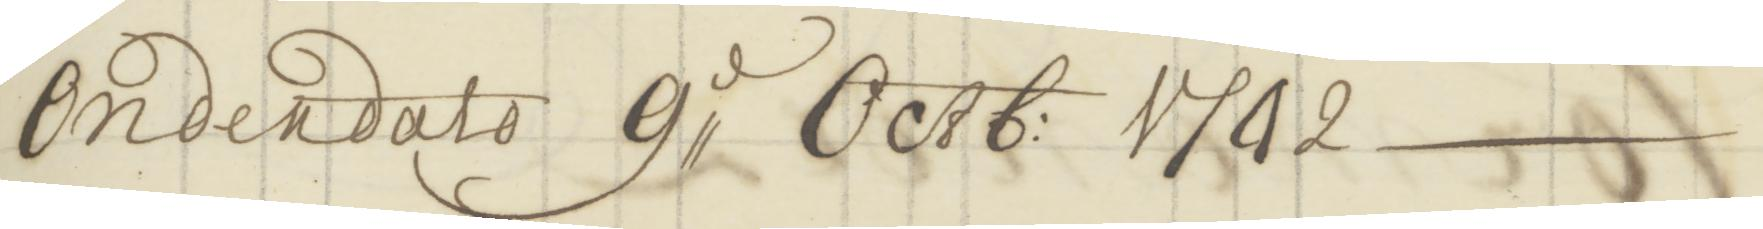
Onder dato 9„e Octb: 1742 —
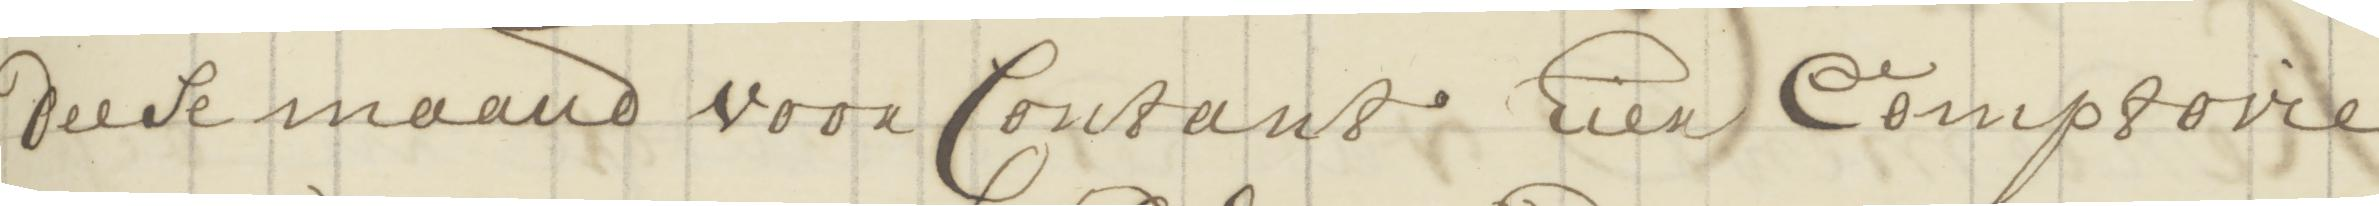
deese maand voor Contant hier Comptoire
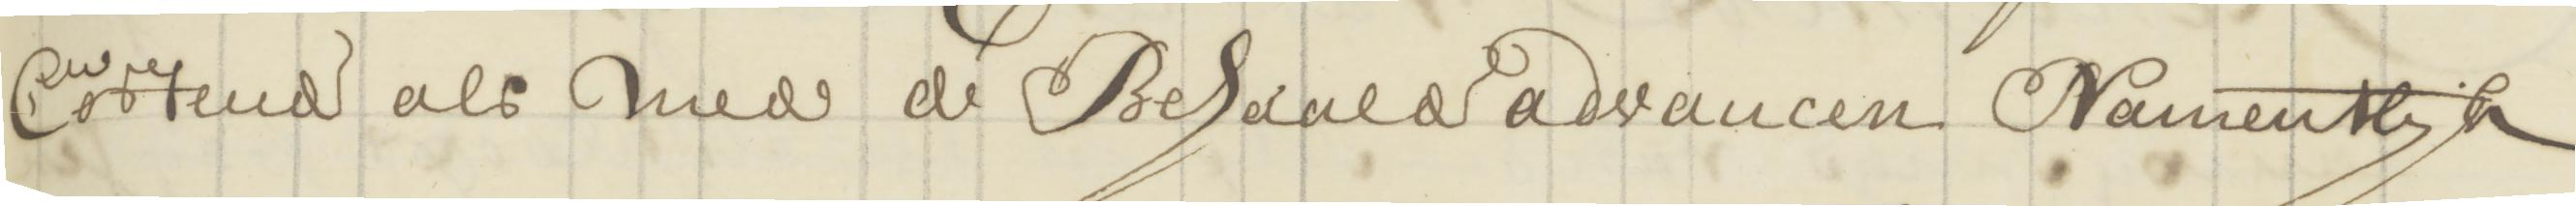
Costende als mede de Behaalde advancen Namentlijk
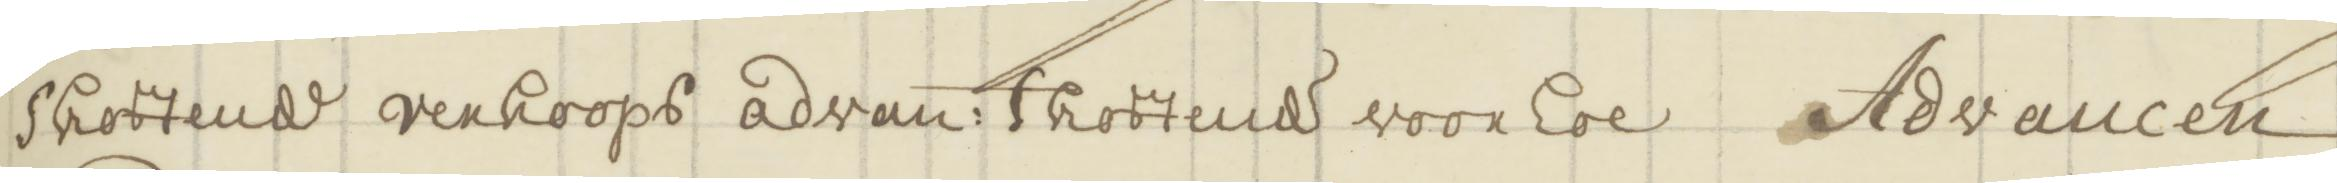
tkostende verkoops advan: tkostende voor hoe Advancen
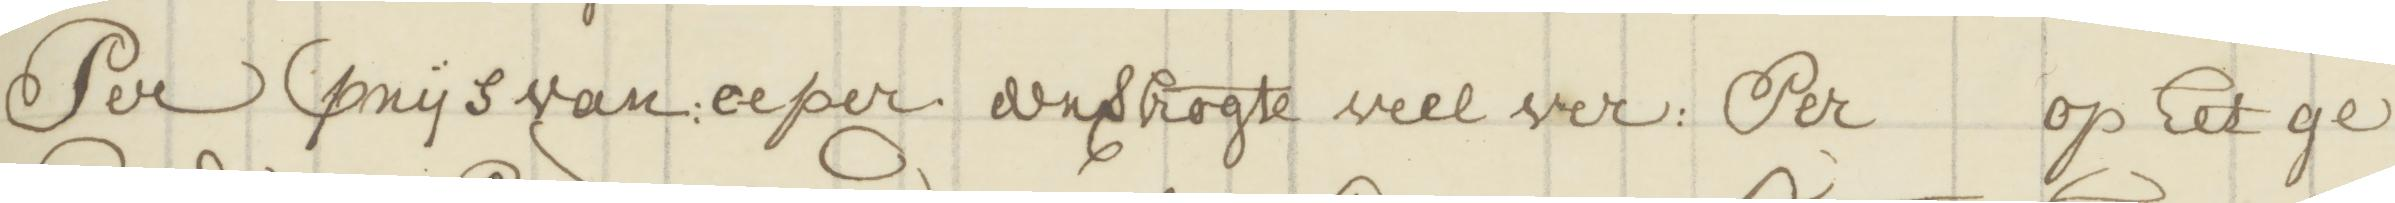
Per prijs van: ce per der verkogte veel ver: Per op het ge
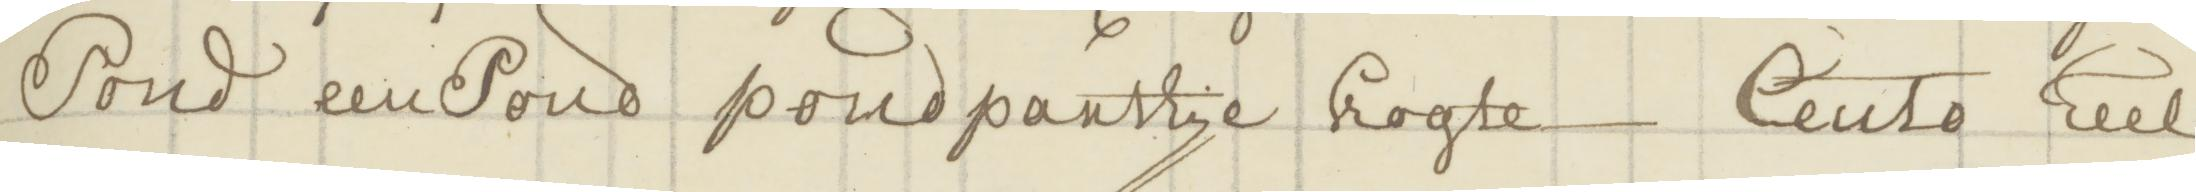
Pond een Pond pond parthije kogte Cento heel
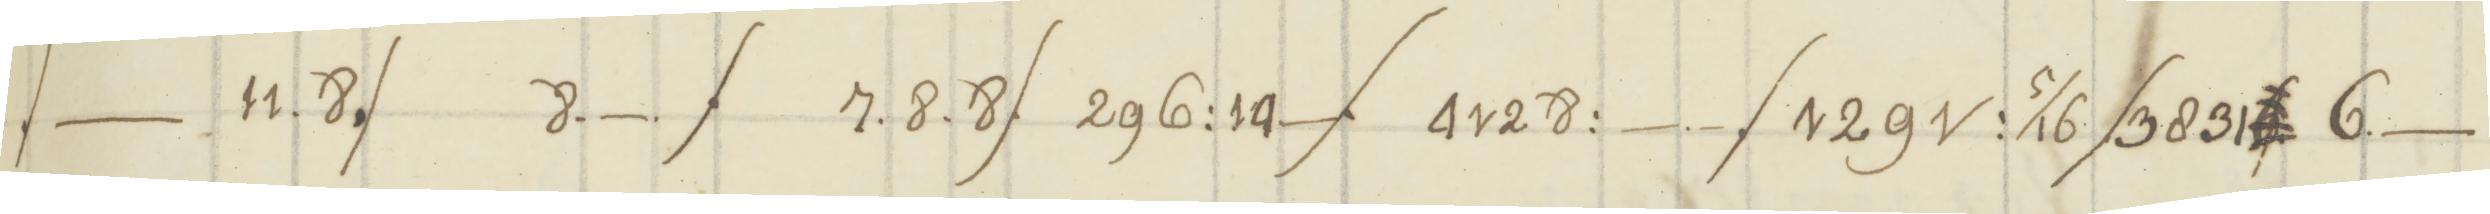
ƒ — 11. 8ƒ 8.—. ƒ 7.8.8—ƒ 296:14—ƒ 4128: —.—ƒ 1291: 5/16 ƒ38316. 6.—
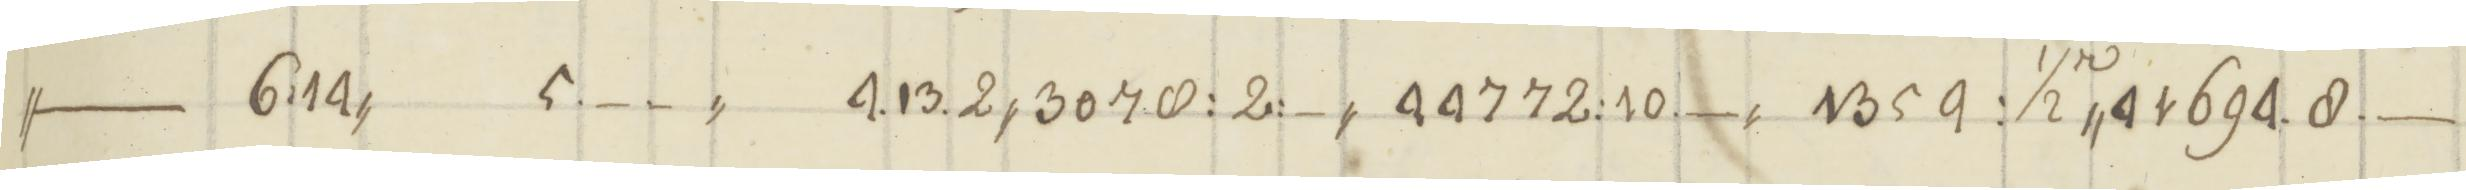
„— 6:14„ 5. — — „ 4.13.2„3078:2:—„ 44772:10.—„ 1354: ½r„41694.8.—
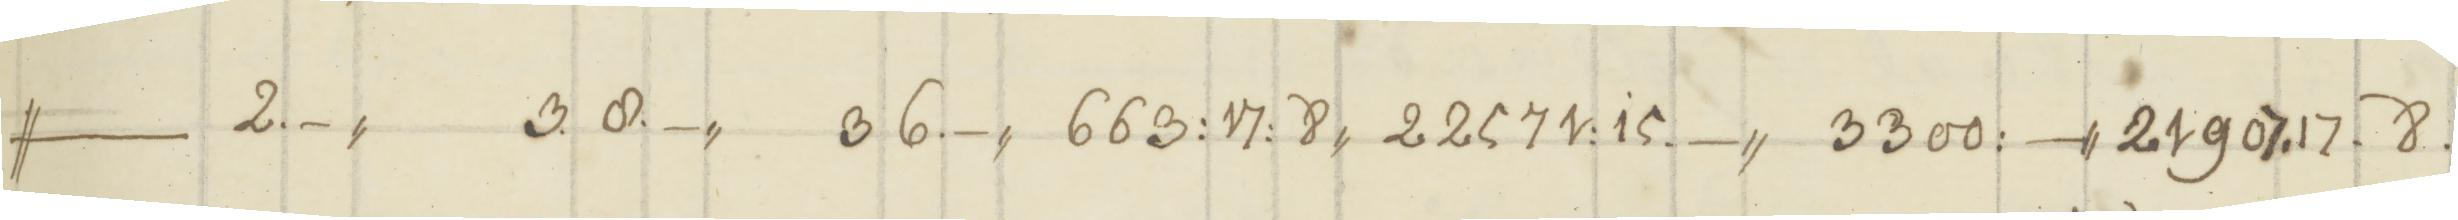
„— 2.—„ 3. 8.—„ 3 6.—„ 663:17:8„ 22571:15.—„ 3300:—„21907.17.8.
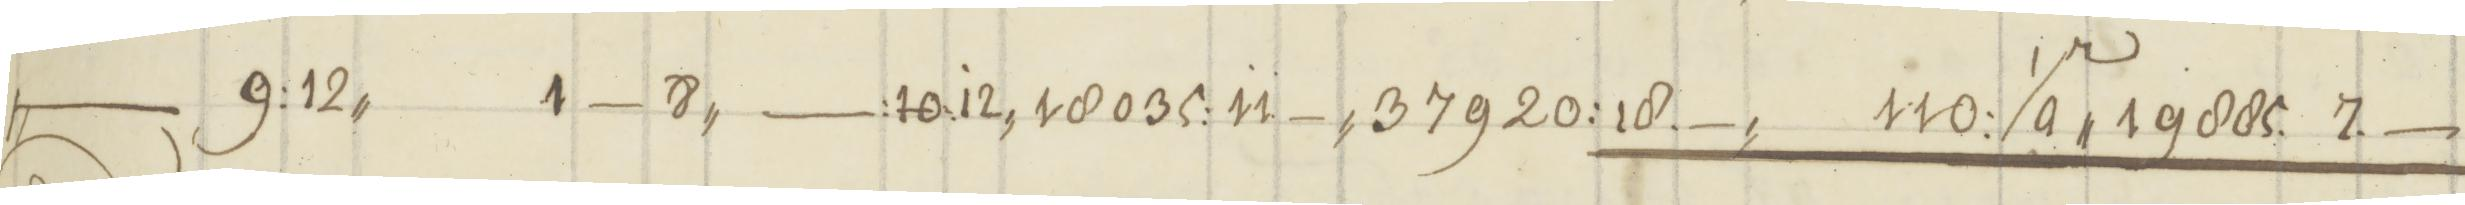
— 9:12„ 1—8„ —:10:12„18035:11:—„37920:18.—„ 110:¼r „ 19885. 7.—
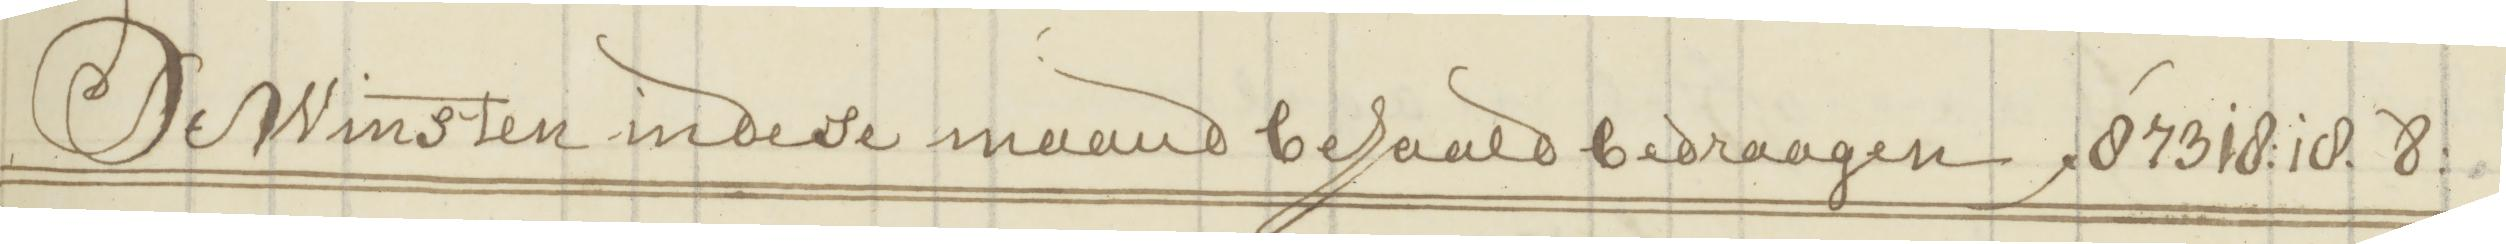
De Winsten in dese maand behaald bedraagen ƒ87318:18. 8:
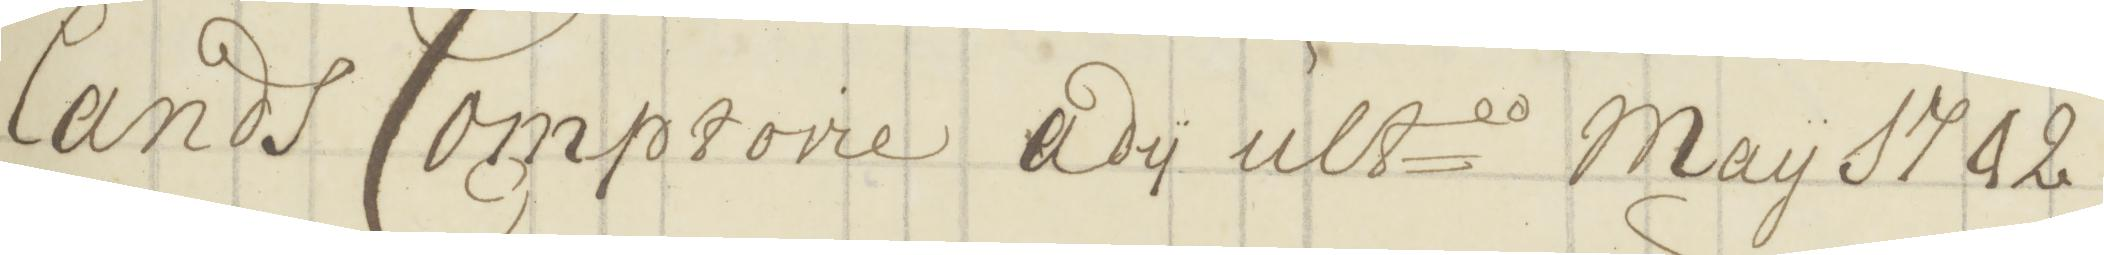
lands Comptorie adij ult=o Maij 1742
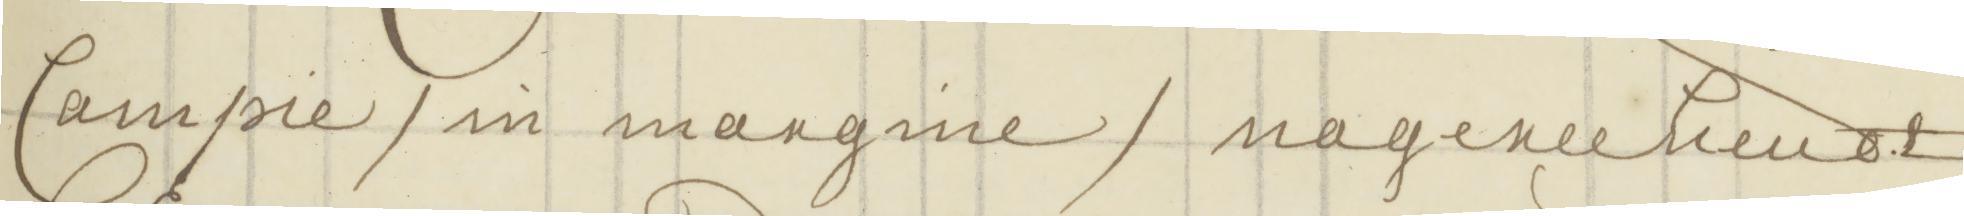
Campie / in margine / nagereekendt
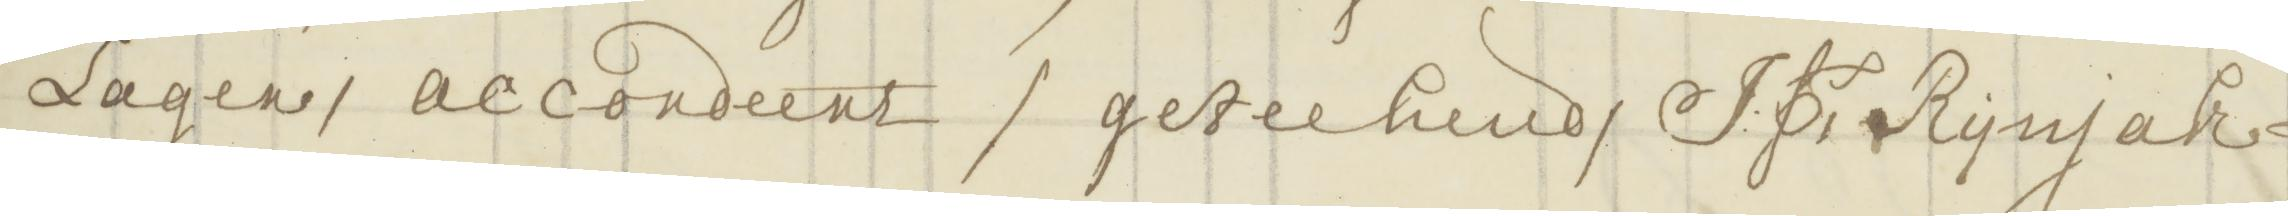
Lager / accordeert / geteekend / I: f,s Rijnjak
